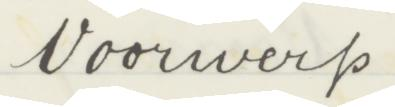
Voorwerp
